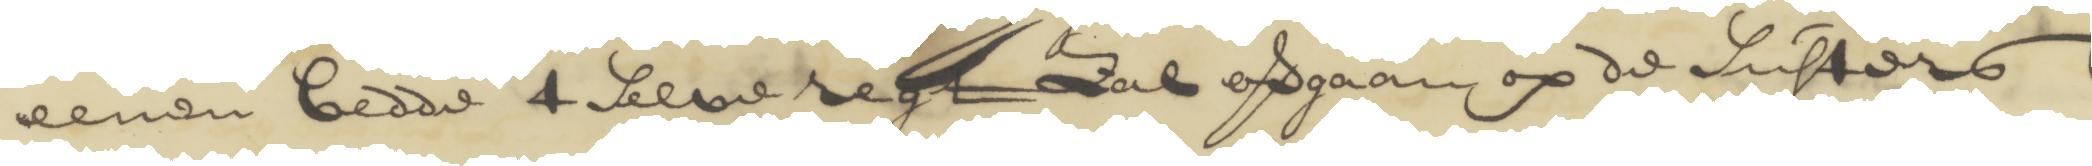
eenen bedde ’t selve regt zal overgaan op de susters
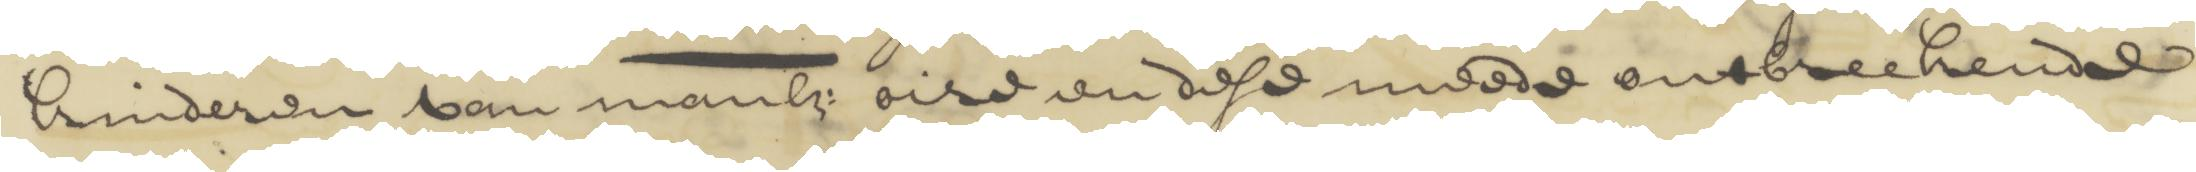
kinderen van manlijk oire en dese meede ontbreekende
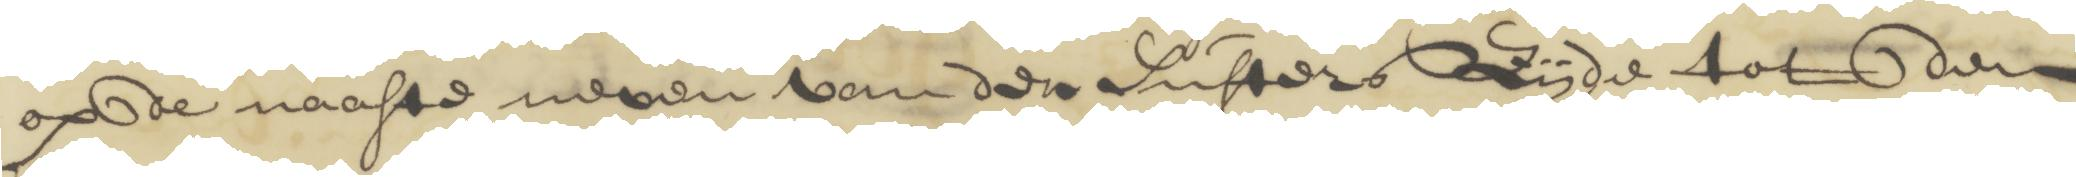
op de naaste neven van den susters zijde tot den
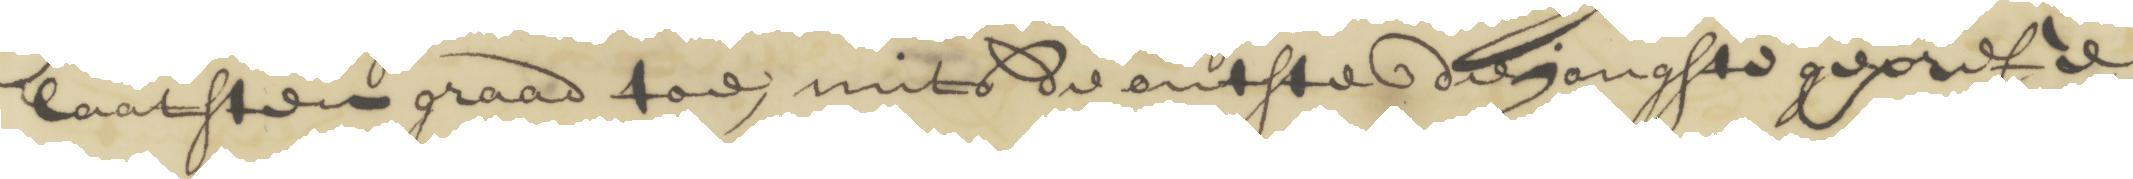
laatsten graad toe, mits de outste de jongste gepref'e
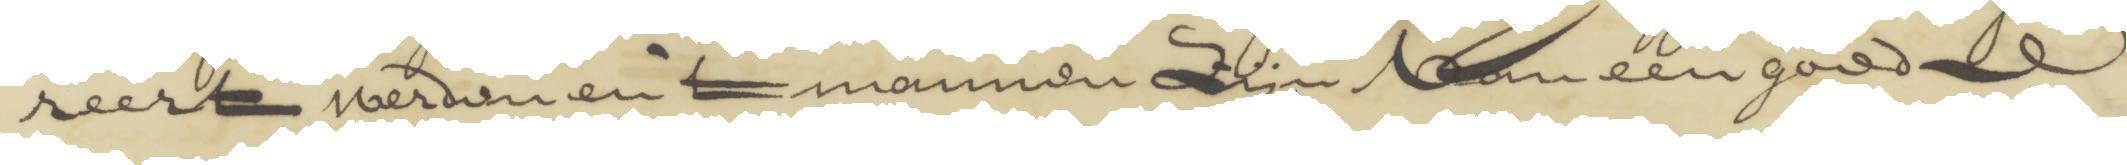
reert werden en ’t mannen zijn van een goede
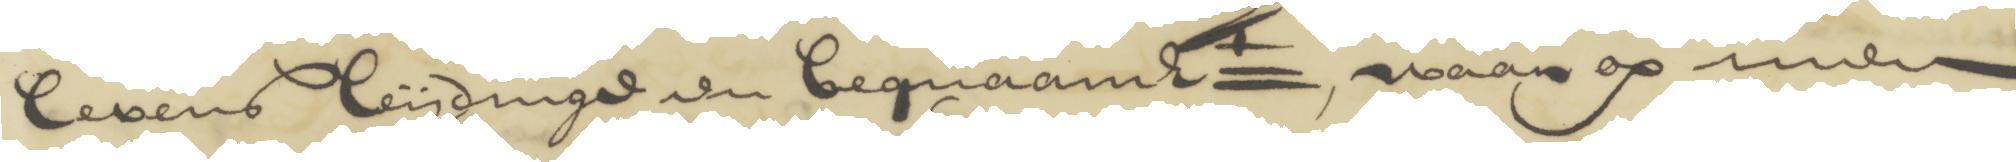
levens leijdinge en bequaamt=t, waar op men
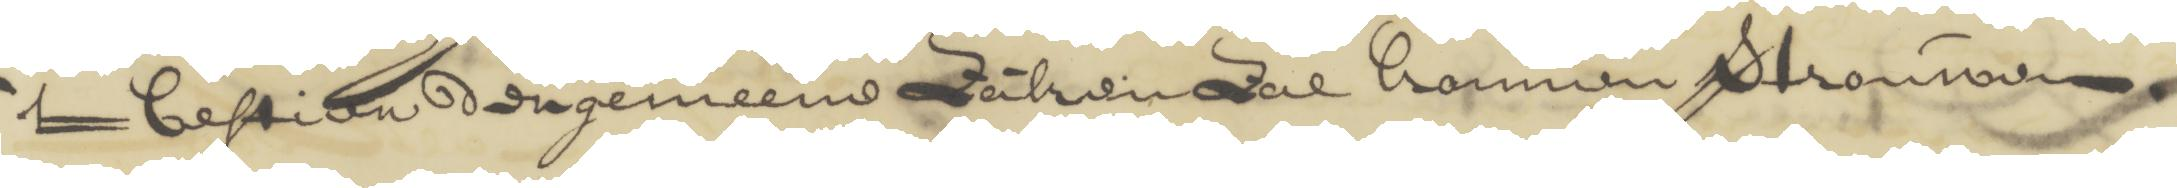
’t bestier der gemeene zaken zal konnen vertrouwen.
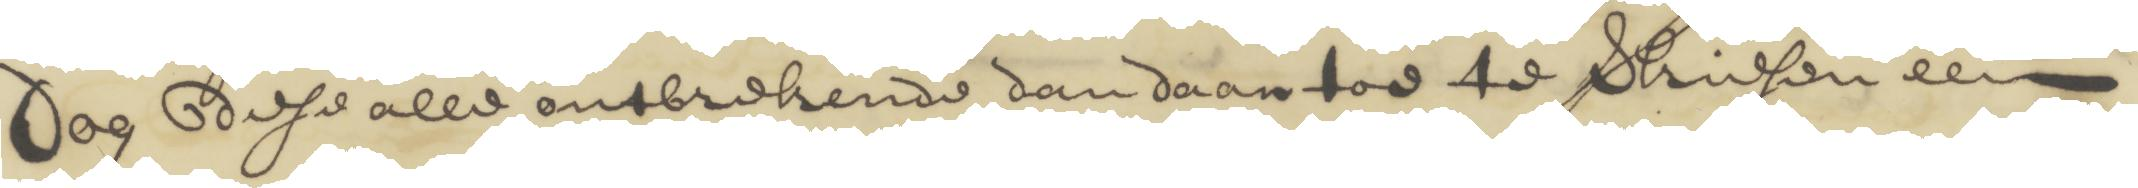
dog dese alle ontbrekende dan daar toe te verkiesen een
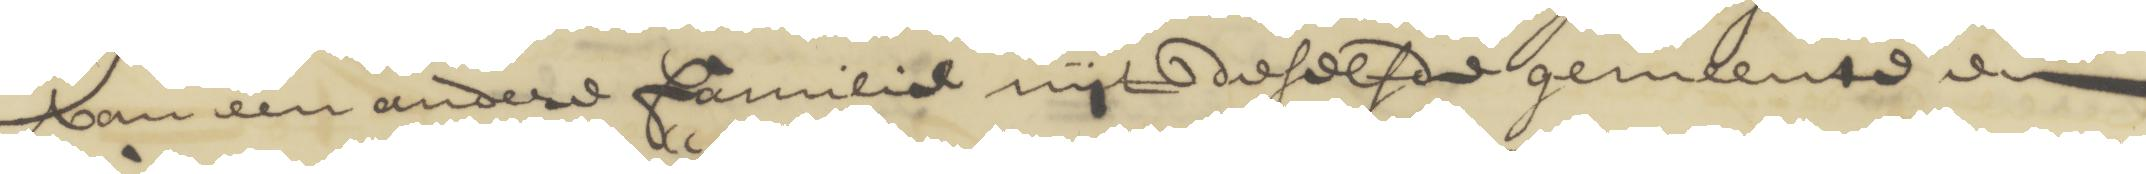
van een andere familie uijt deselfde gemeente en
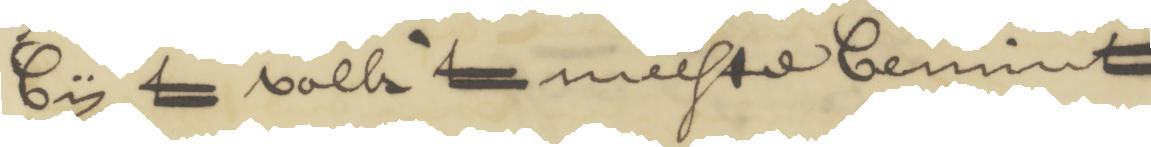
bij ’t volk ’t meeste bemint.
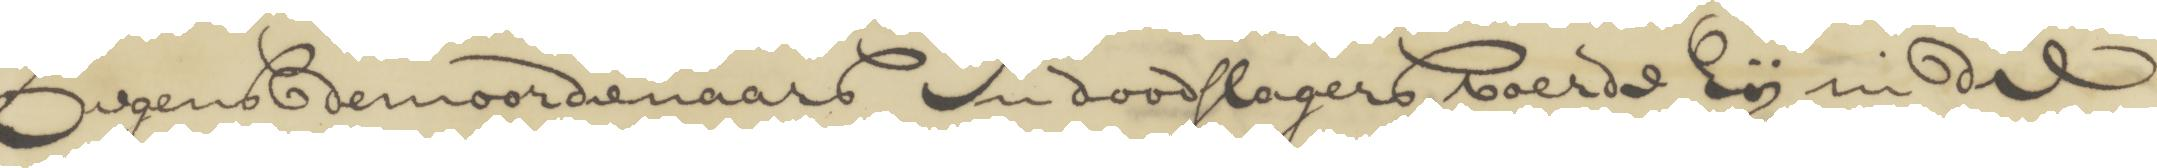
Tegens de moordenaars En doodslagers voerde hij in de
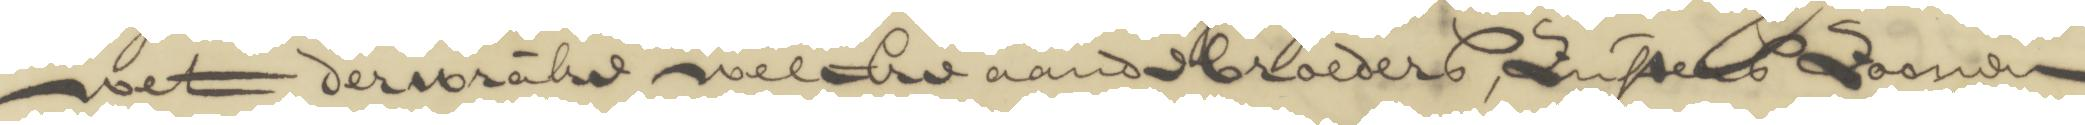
wet der wrake welcke aande broeders, zusters zoonen
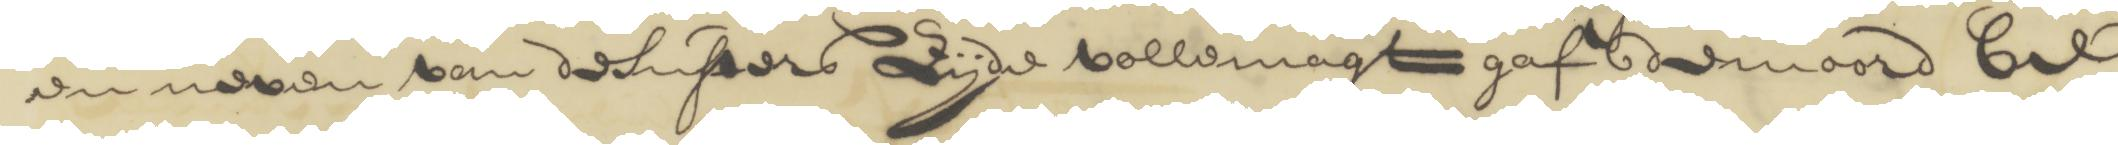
en neven van de susters zij de vollemagt gaf de moord be
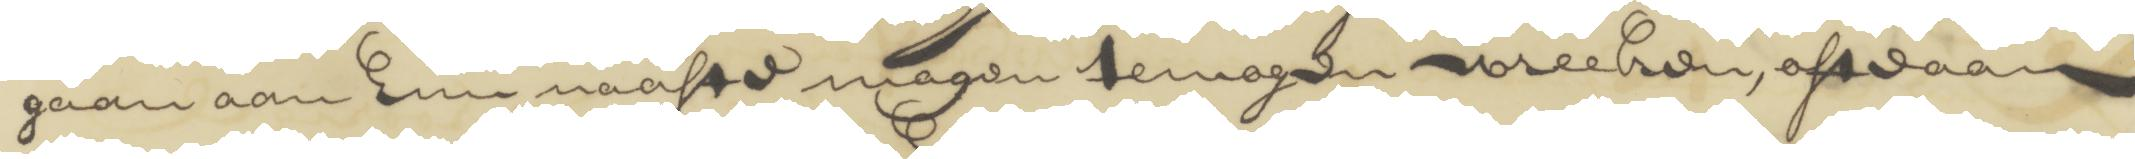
gaan aan hun naaste magen te mogen wreeken, ofte aan
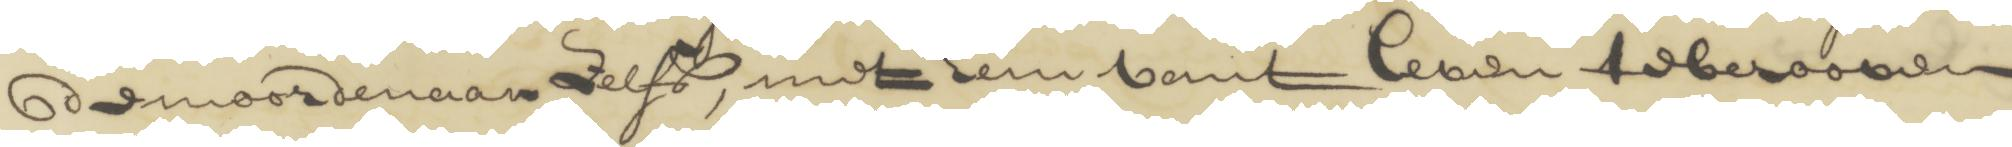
de moordenaar zelfs, met hem van't leven te berooven
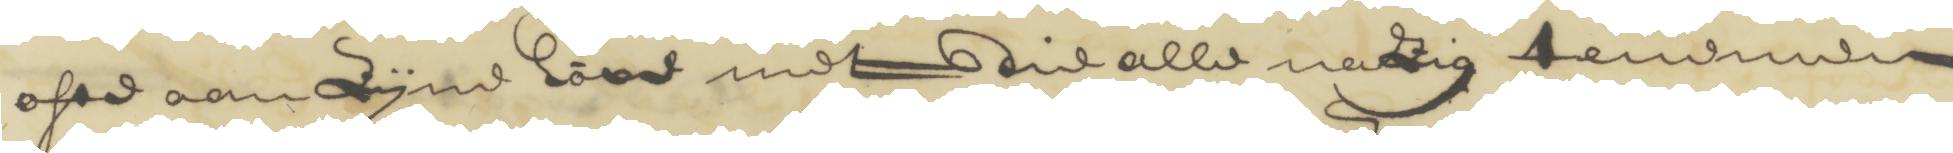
ofte aan zijne hove met die alle na zig te nemen
